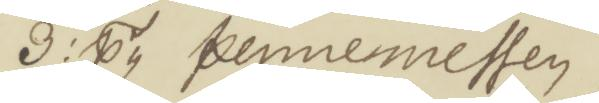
3: p„s pennemessen
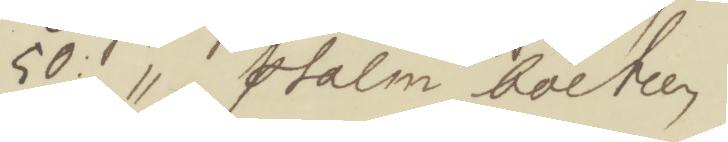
50: „ psalm boeken
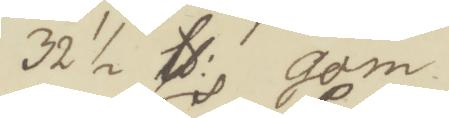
32½ lb: gom
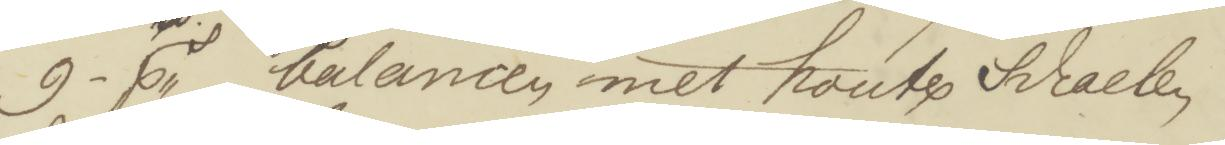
9 - p„s balancen met houte schaelen
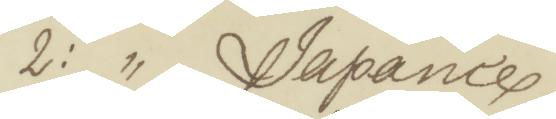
2: „ Iapance
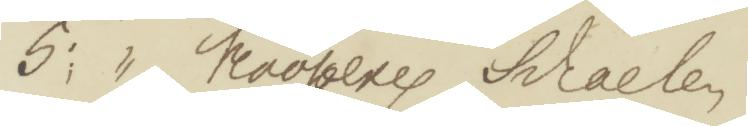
5: „ koopere schaelen
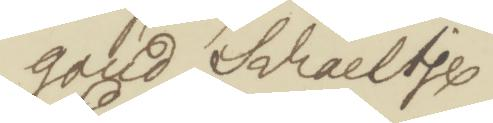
goud schaeltje
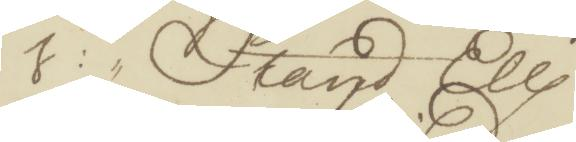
1: „ Stand Ell
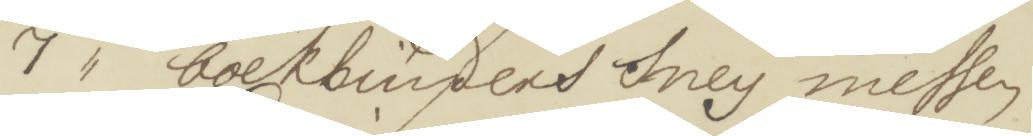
7 „ boekbinders sneij messen
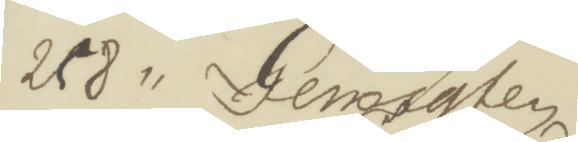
258 „ Gewigten
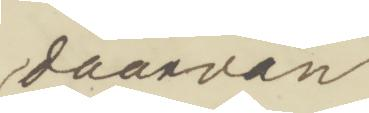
daarvan
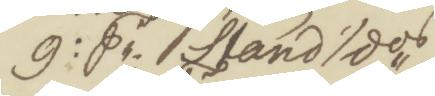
9: p„.s Stand d„os
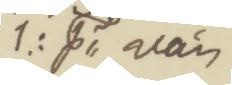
1: p„s van
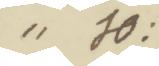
„ 10
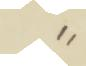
„ 5
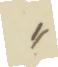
½ „
